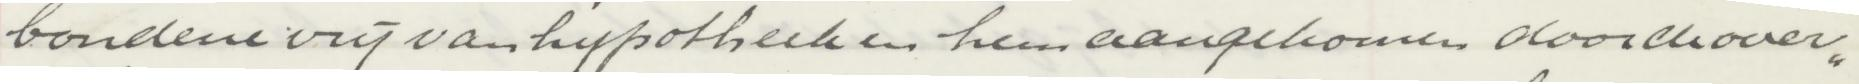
bondene vrij van hypotheek en hem aangekomen door de over„
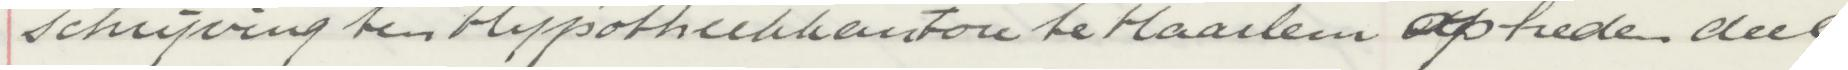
schrijving ten Hypotheekkantore te Haarlem op heden deel
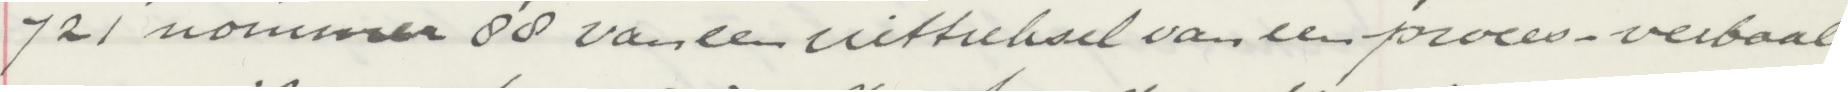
721 nommer 88 van een uittreksel van een proces-verbaal
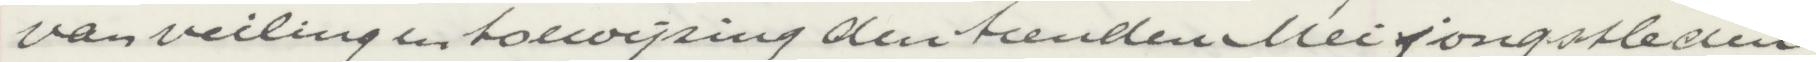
van veiling in toewijzing den tienden Mei jongstleden
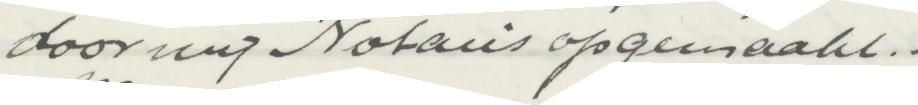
door mij Notaris opgemaakt.
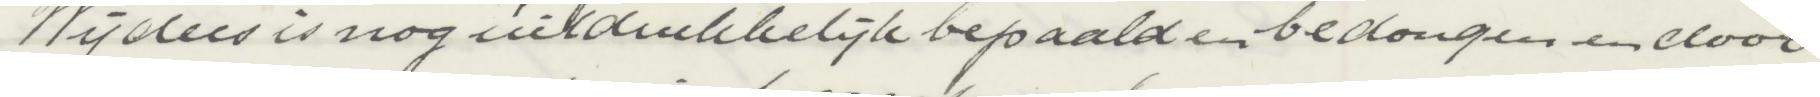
Wijders is nog uitdrukkelijk bepaald en bedongen en door
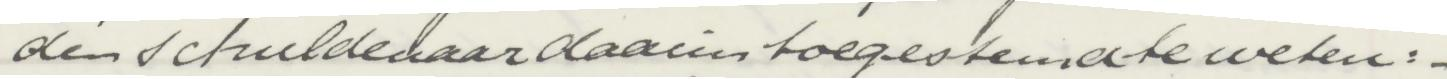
de schuldenaar daarin toegestemd te weten:
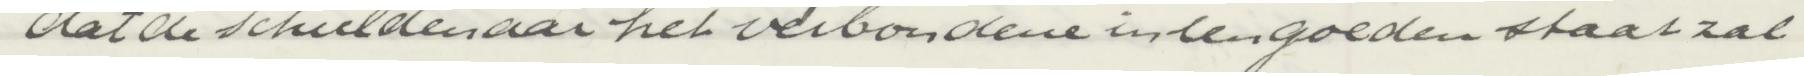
dat de schuldenaar het verbondene in een goeden staat zal
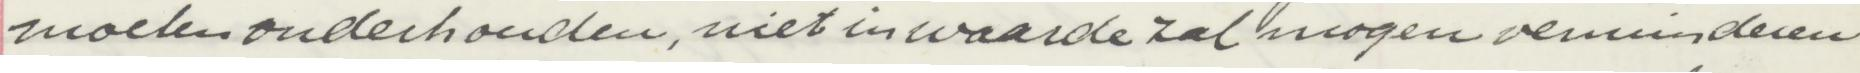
moeten onderhouden, niet in waarde zal mogen verminderen
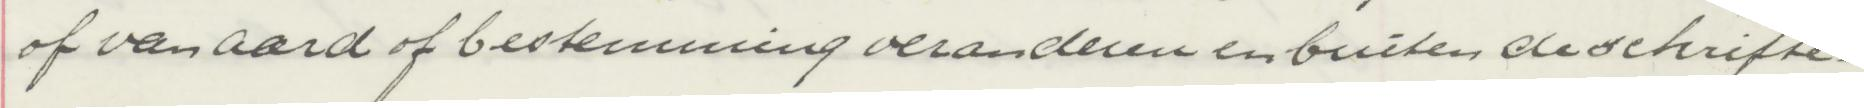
of van aard of bestemming veranderen en buiten de schrifte-
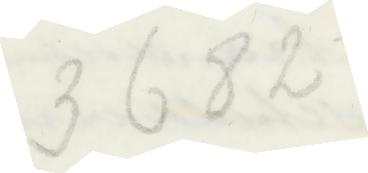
3682
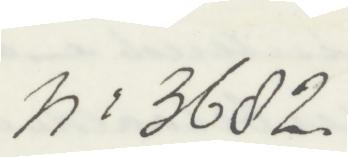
N: 3682
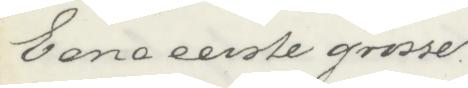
Eene eerste grosse.
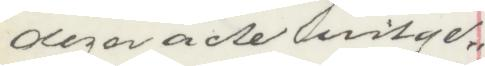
dezer acte uitge
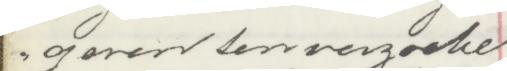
„geven ten verzoeke
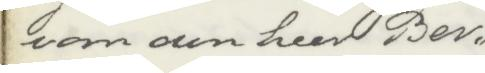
van den heer Ber„
